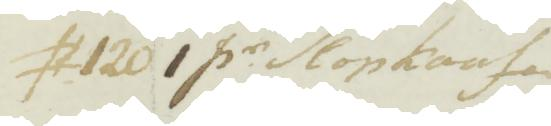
#120 1 p.r Slopkousen
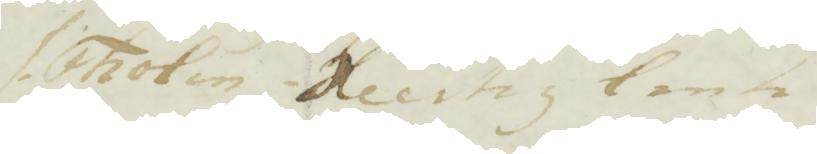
J.Tholen - Veertig Cents
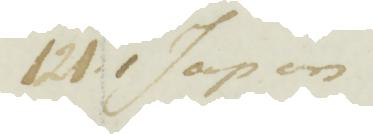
121.1 Japon
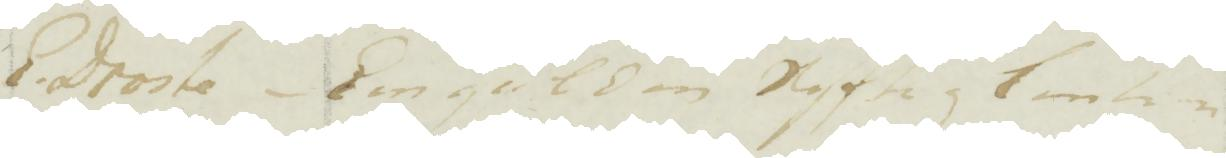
E. Droste —Een gulden Vyftig Cents
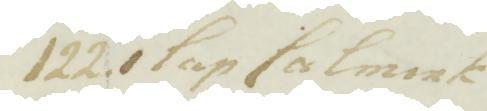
122.1 lap Calmink
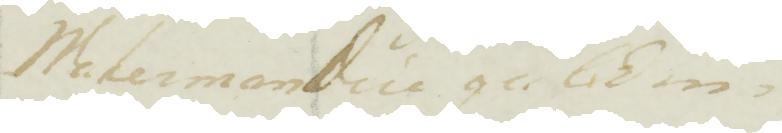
Wederman drie guldens
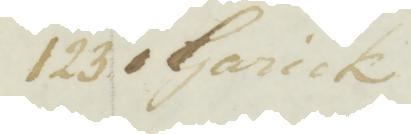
123. 1 Garick
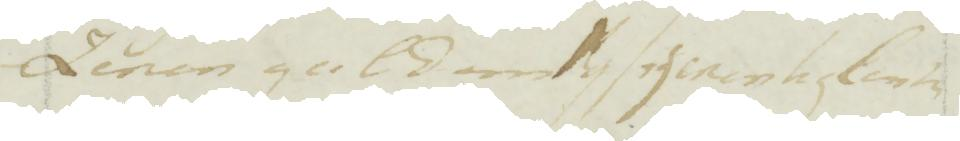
Zeven guldens vijf zeventig Centen
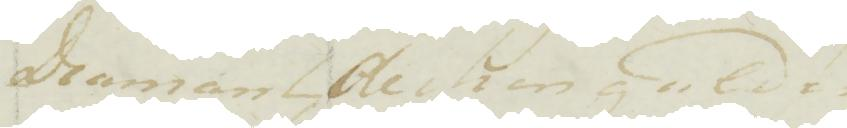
Diamant dertien guldens.
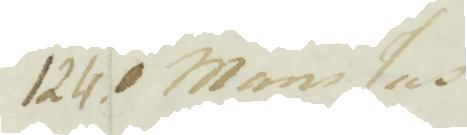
124.1 Mans Jas
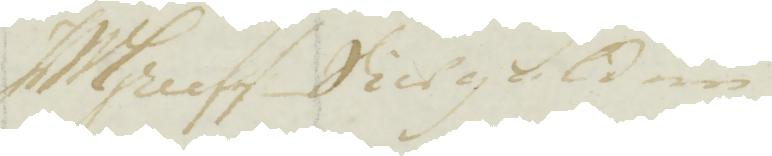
JWGreeff Vier guldens
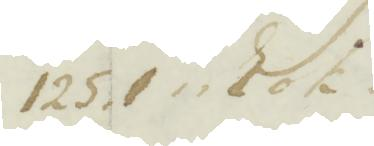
125. 1 „ rok
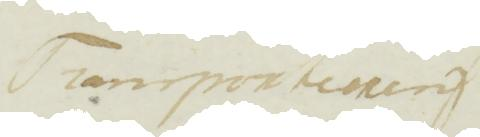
Transporteerenƒ
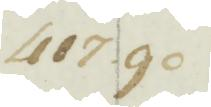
ƒ 417.90
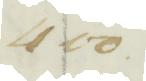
4 10.
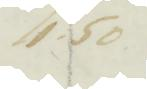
4.50.
